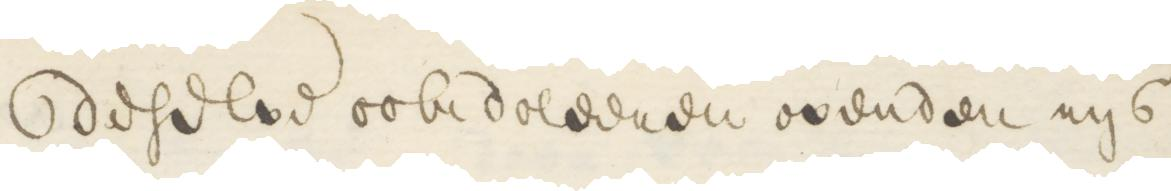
deselve ook doleeren over den rijs
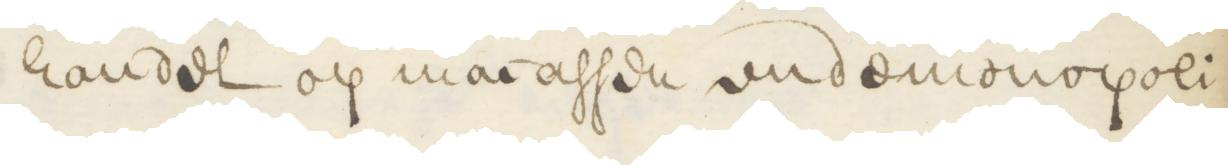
handel op macasser en de monopoli
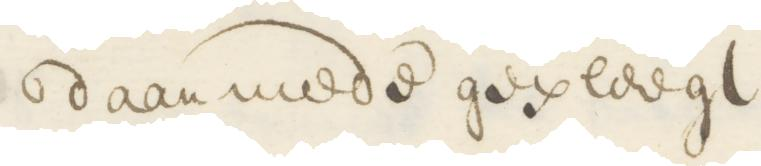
daar mede gepleegt
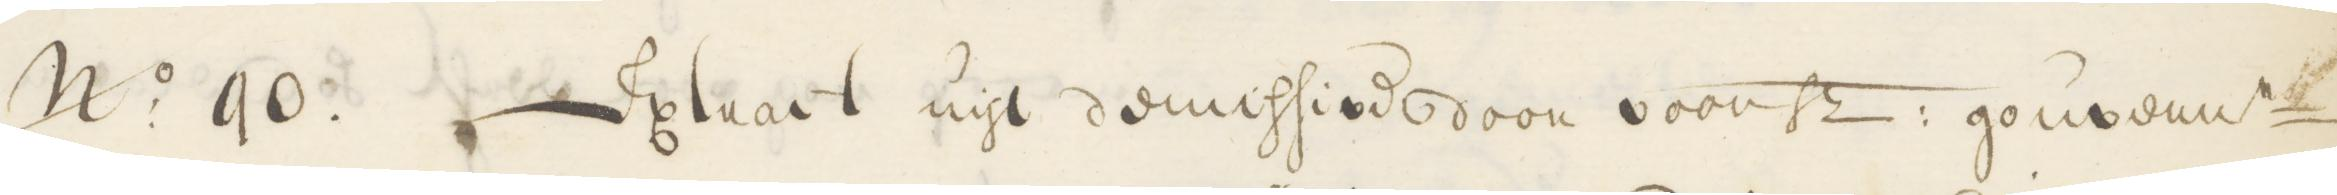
N:o 40. Extract uijt de missive door voorsz: gouvern=r
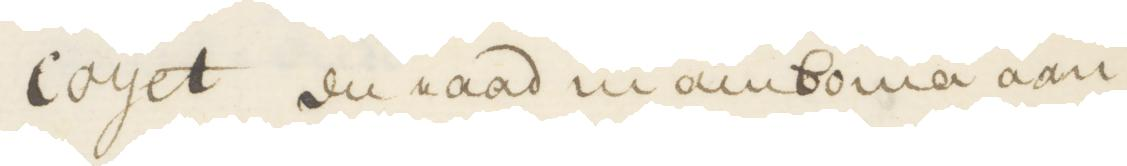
Coijet en raad in amboina aan
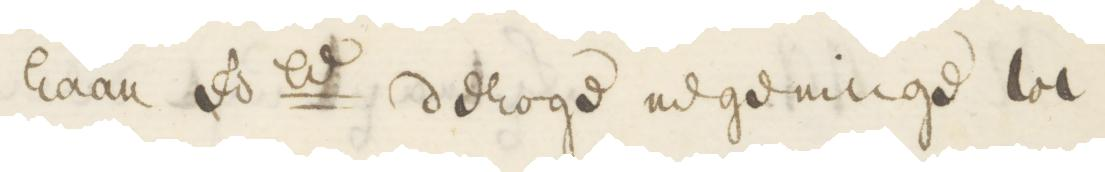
haar Ed=le dehoge regeninge tot
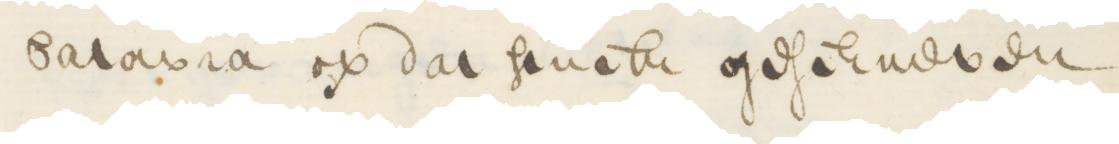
batavia op dat stuck geschreven
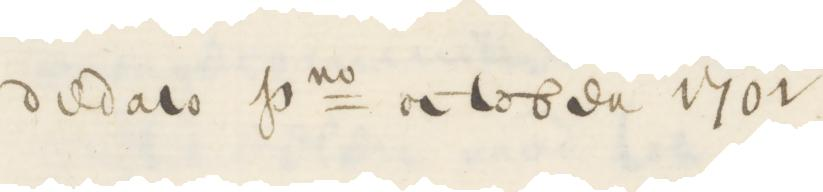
dedato p=ro october 1701
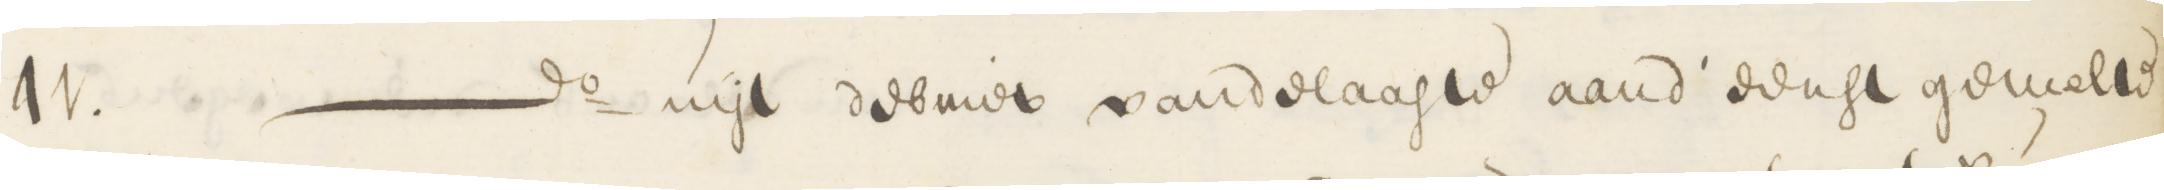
11. D=o uijt deb niet van delaaste aan d’ eerst gemelte
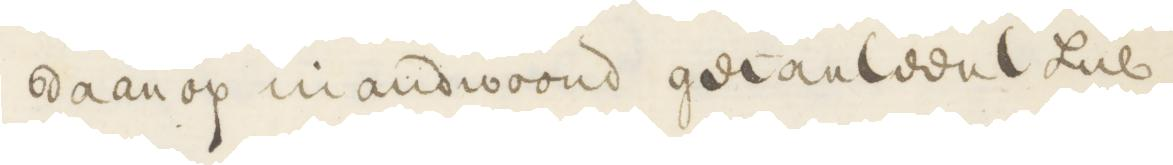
daar op in andwoord gecarteert sul
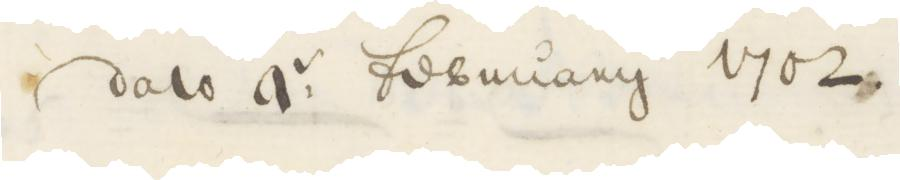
dato 4:e februarij 1702.
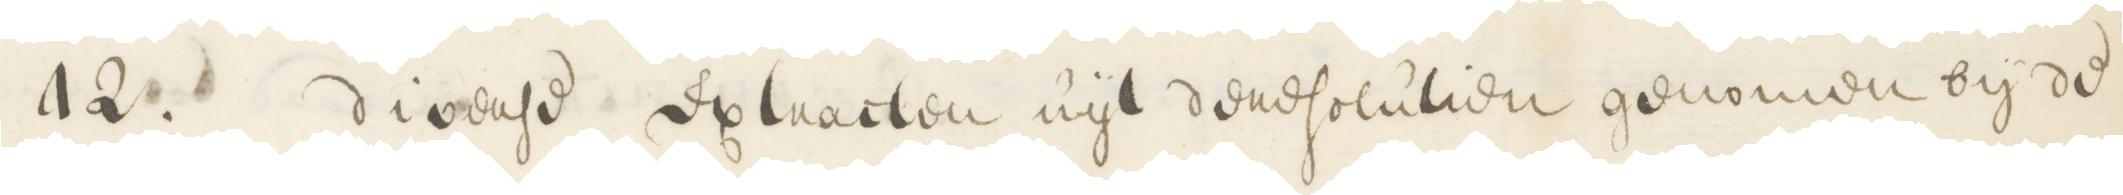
42. diverse Extracten uijt deresolutien genomen bij de
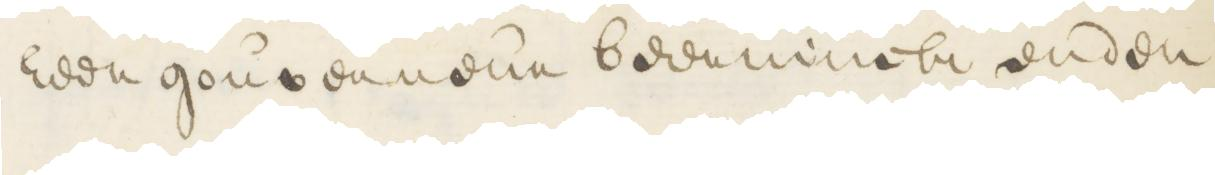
heer gouverneur beerninck en den
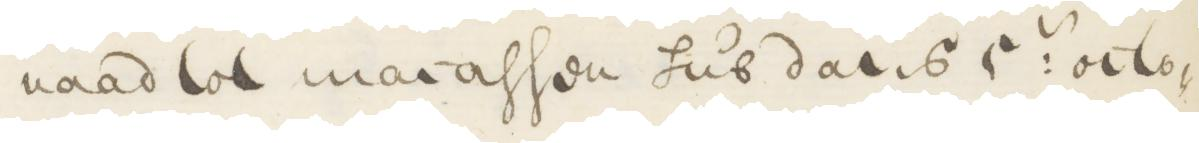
raad tot macasser sub datis 5:en octo„
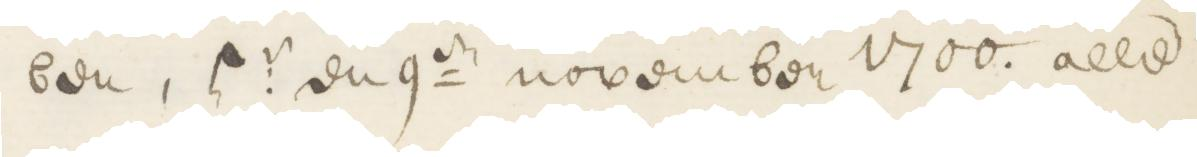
ber, 5:en 9=en november 1700. alle
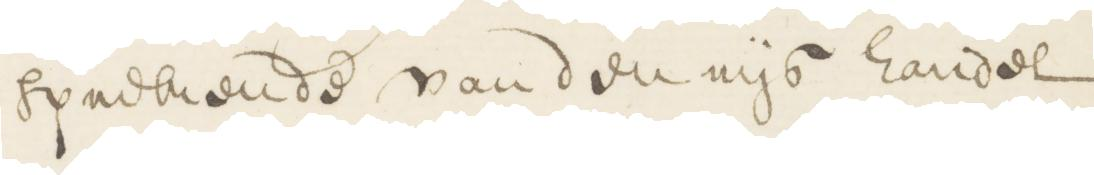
sprekende van den rijs handel
